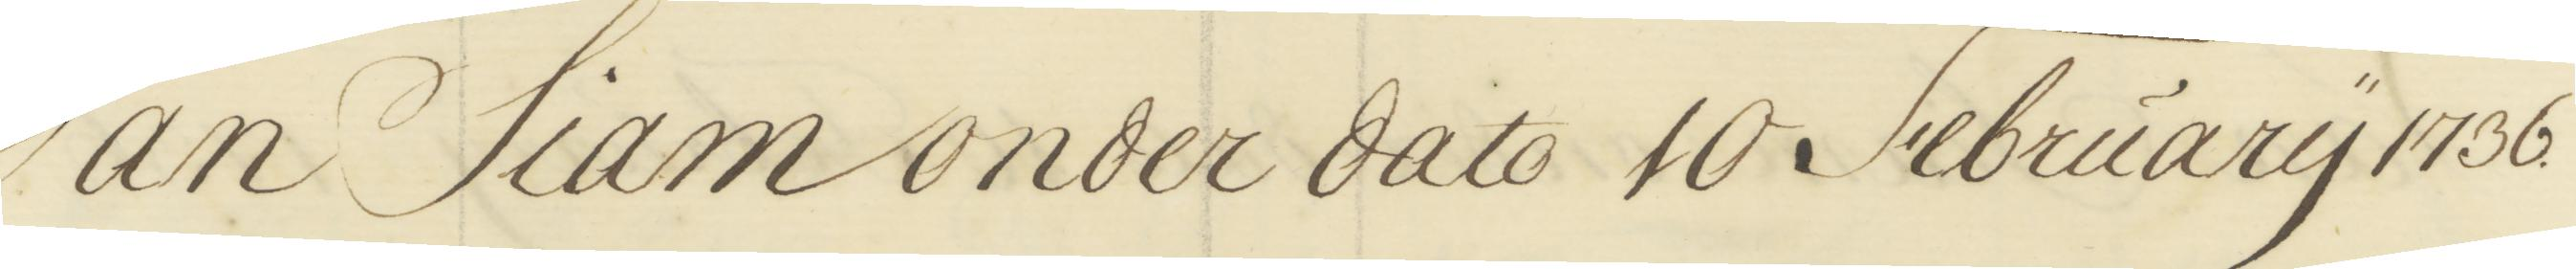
Van Siam onder dato 10 Februarij 1736.
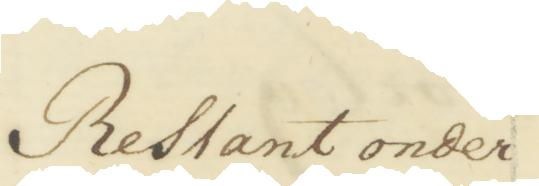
Restant onder
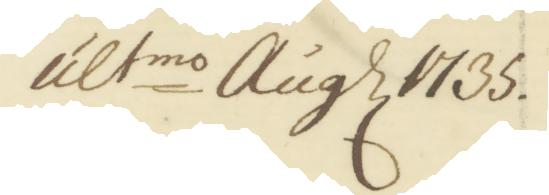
ult=mo Augs 1735.
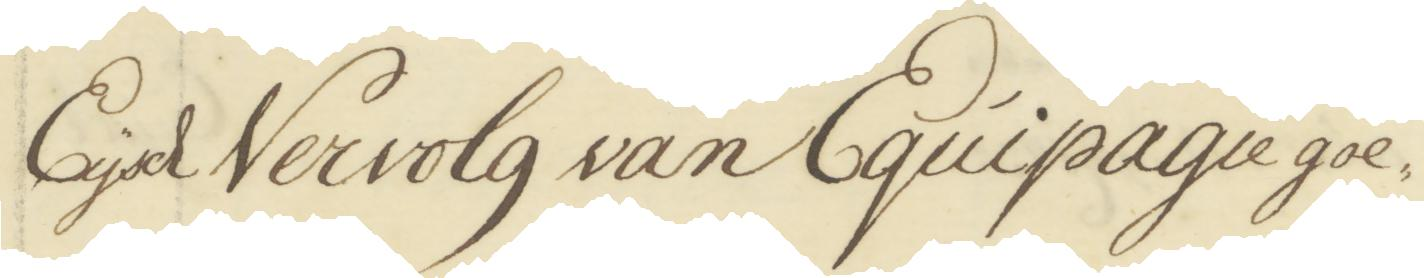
Eijsch Vervolg van Equipagie goe„
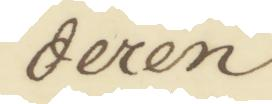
deren
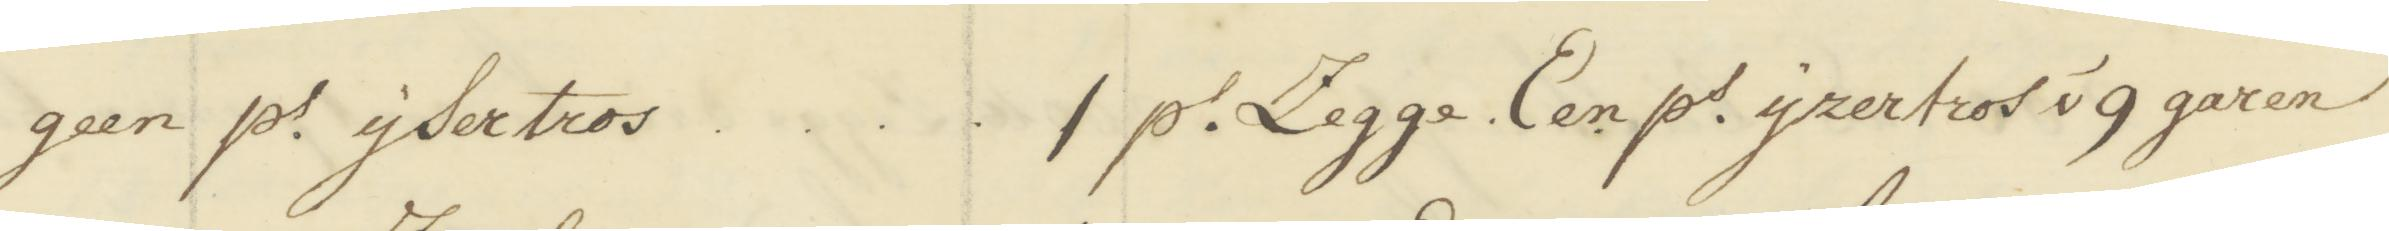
geen p.s ijsertros . . . . 1 p.s Zegge. Een p.s ijzertros 19 garen
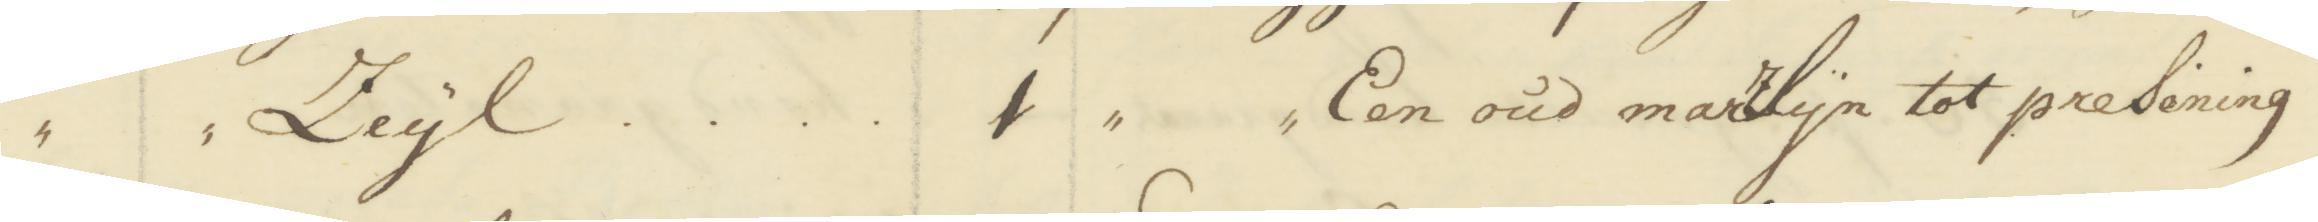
„ „ Zeijl . . . . 1 „ „ Een oud marRlijn tot presening
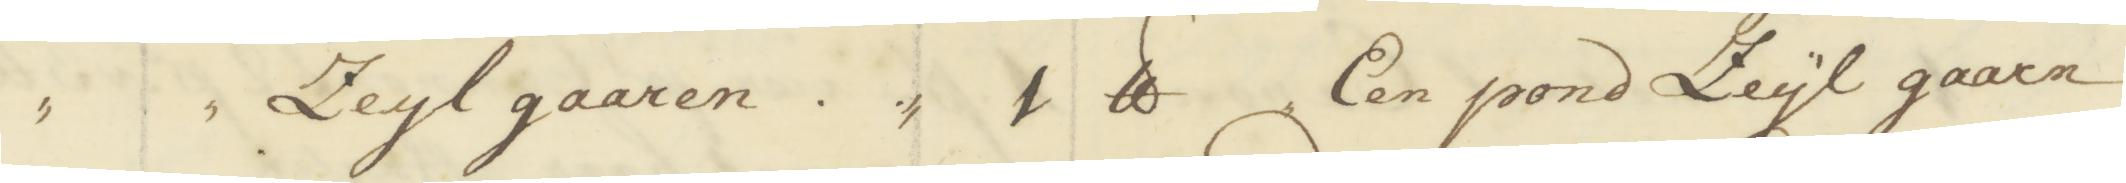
„ „ Zeyl gaaren . .„ 1 lb „ Een pond Zeijl gaarn
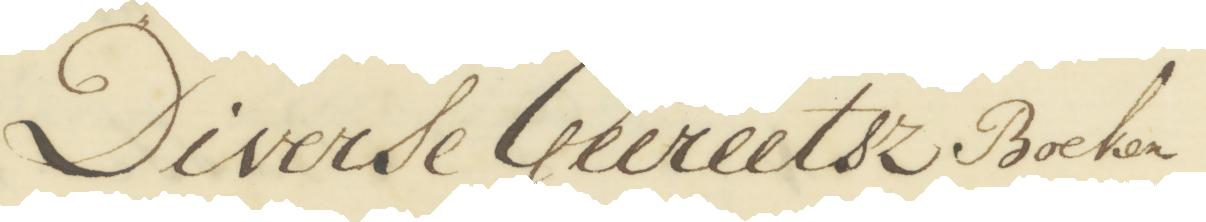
Diverse Geereetsz Boeken
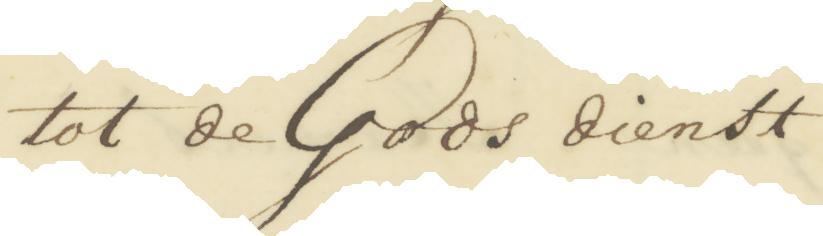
tot de Gods dienst
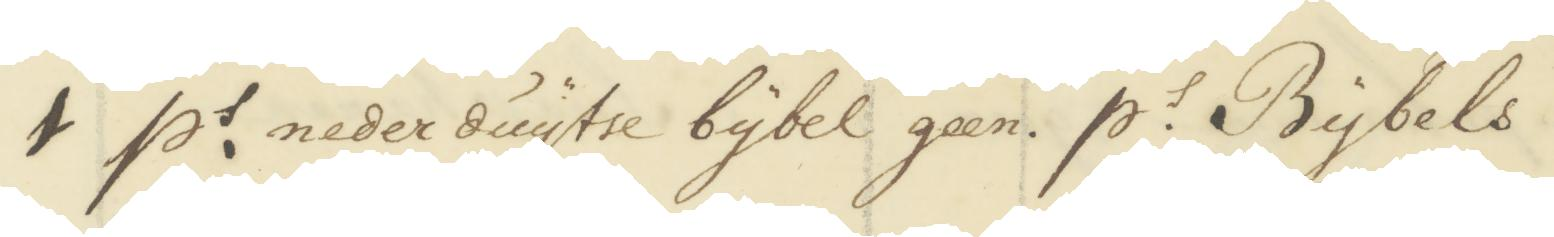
1 p.s neder duijtse bijbel geen. p.s Bijbels
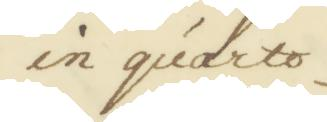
in quarto
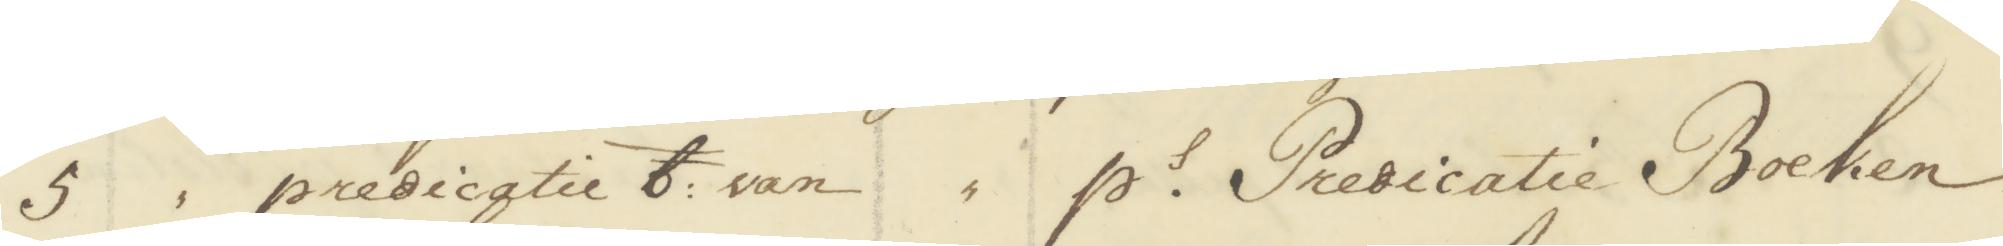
5 „ predicatie b: van „ p.s Predicatie Boeken
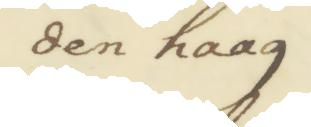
den haag
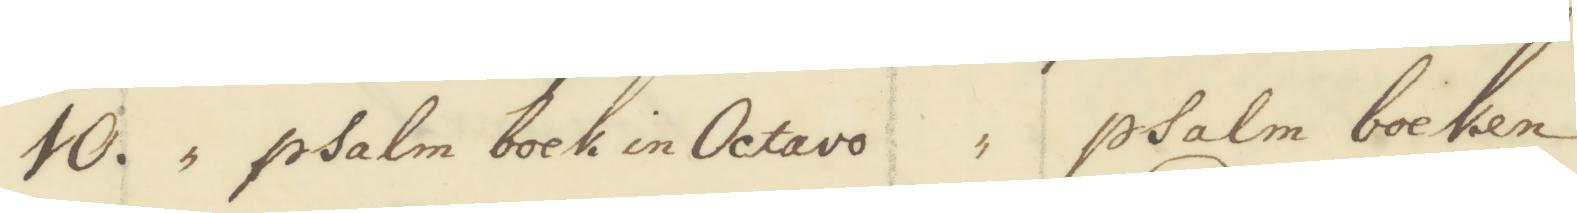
10. „ psalm boek in Octavo „ psalm boeken
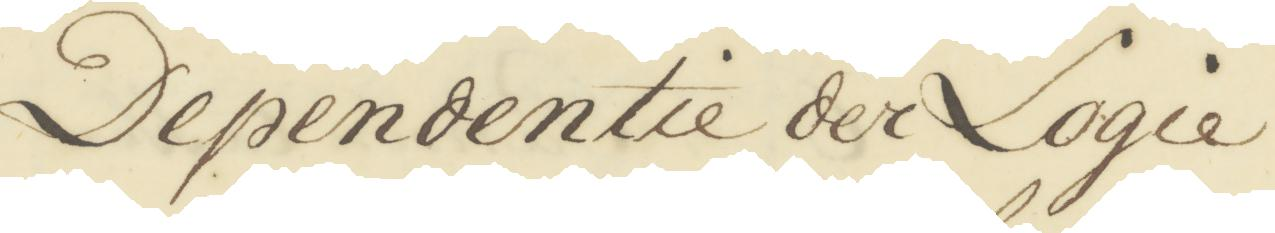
Dependentie der Logie
